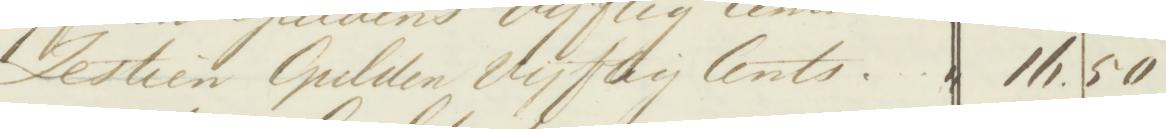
Zestien Gulden Vijftig Cents . . . „ 16.50
